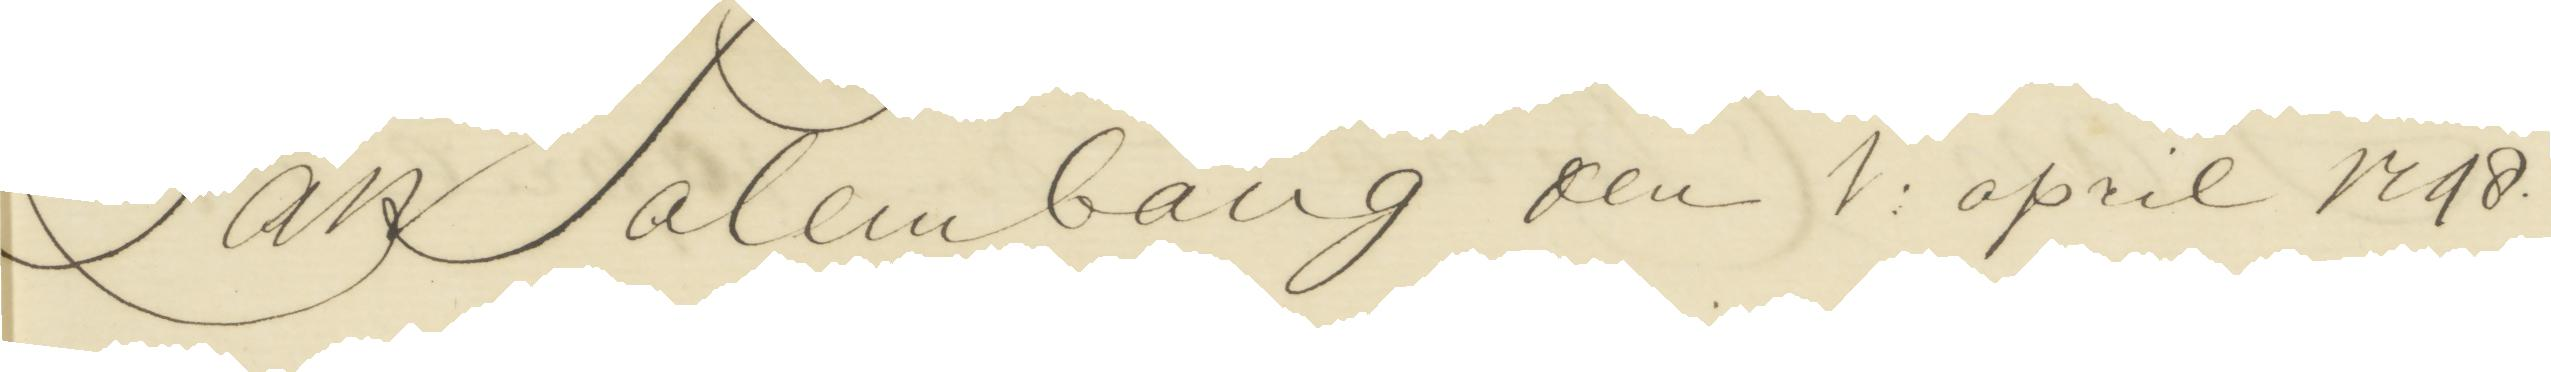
Van Palembang den 1:' april 1748.
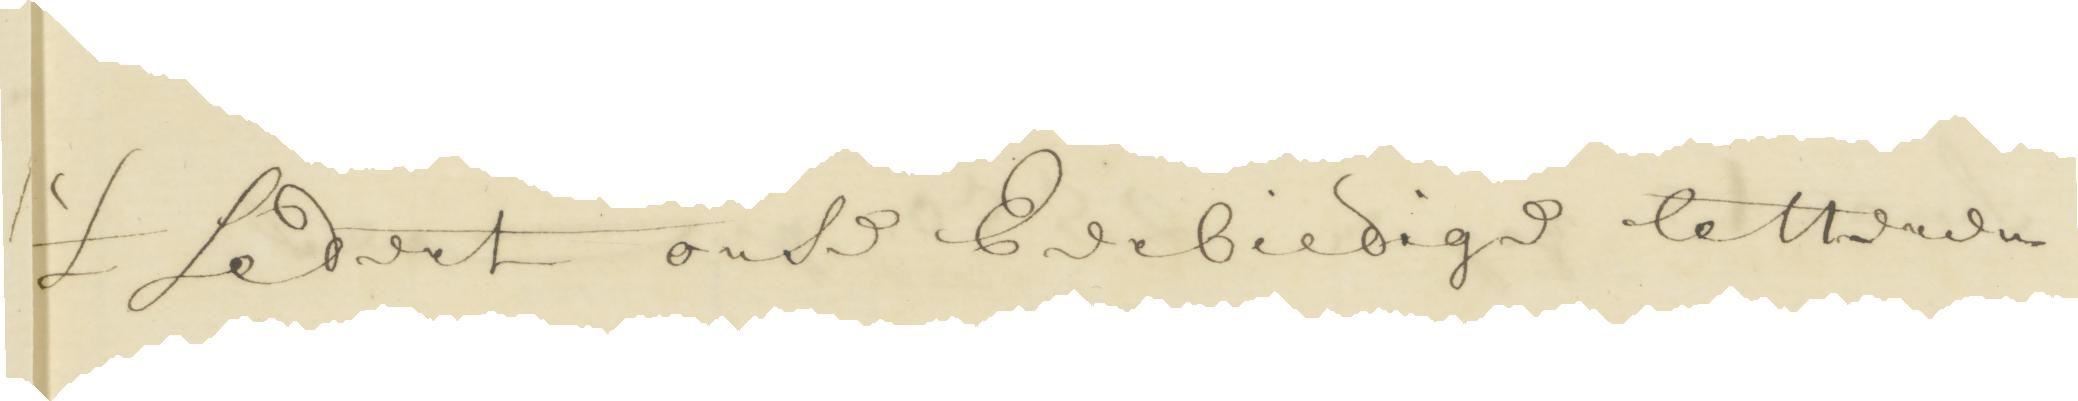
't sedert onse Eerbiedige letteren
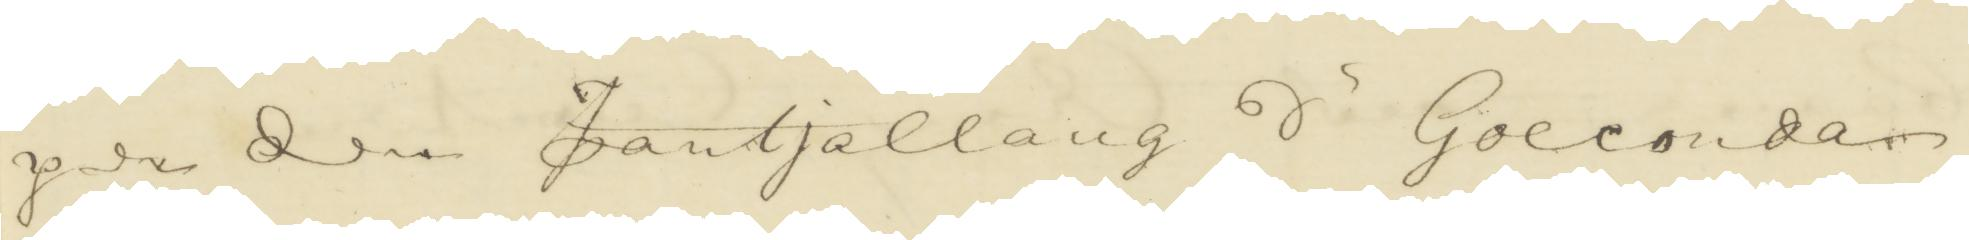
per den Pantjallang d' Goeconda
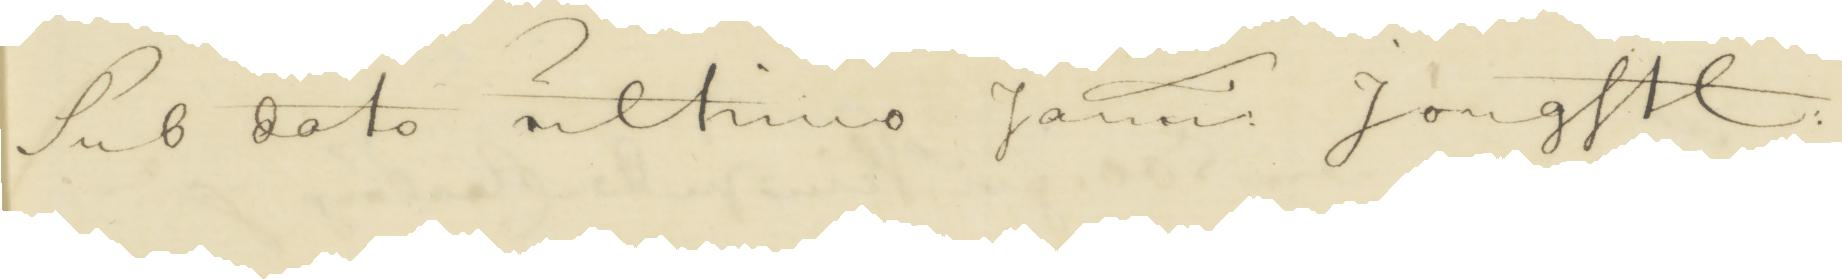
sub dato ultimo Jann: Jongstl:
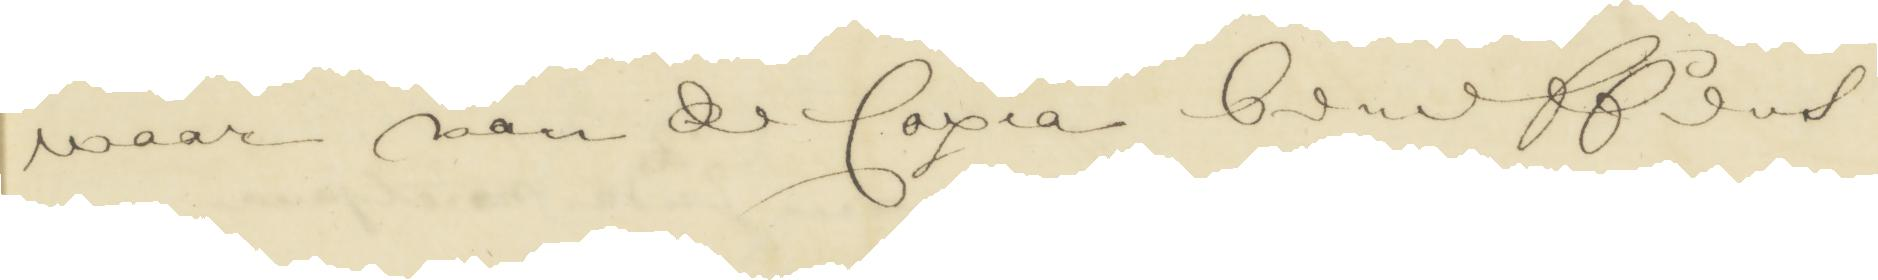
waar van de Copia beneffens
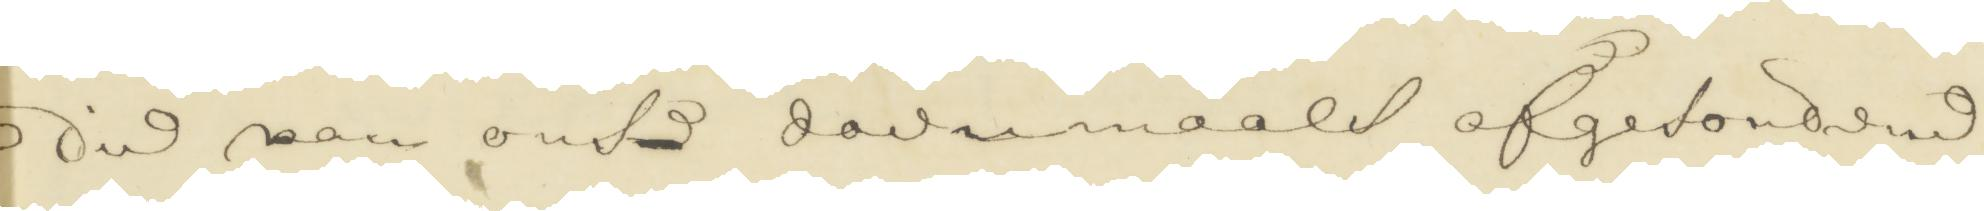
die van onse doenmaals afgesondene
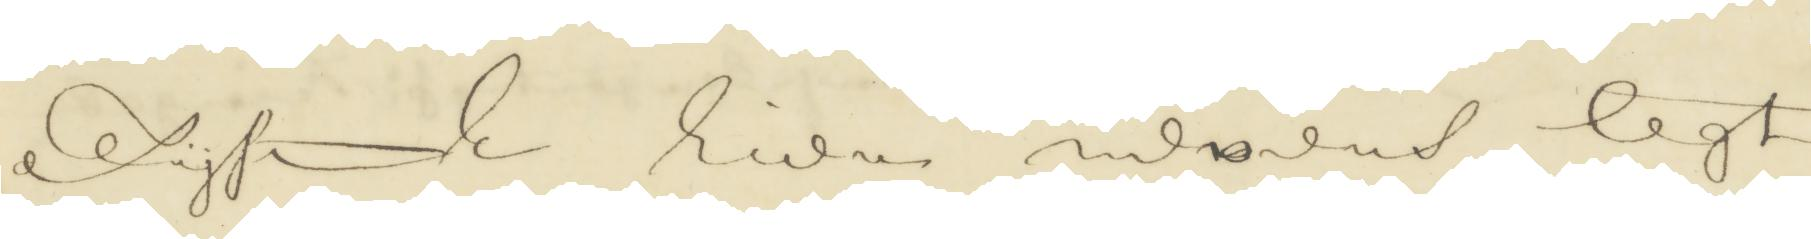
Eijsch hier nevens legt
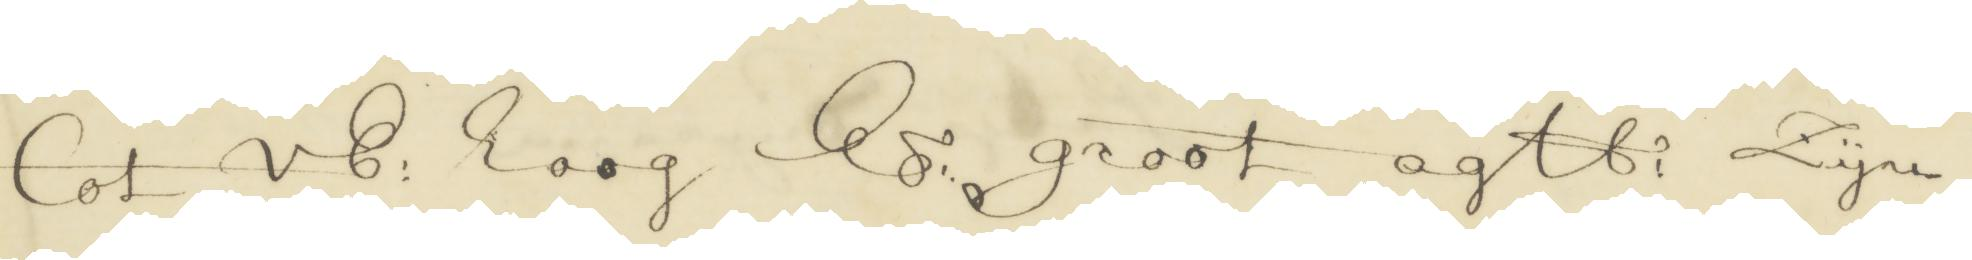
tot vE: hoog Ed:e groot agtb:e zijn
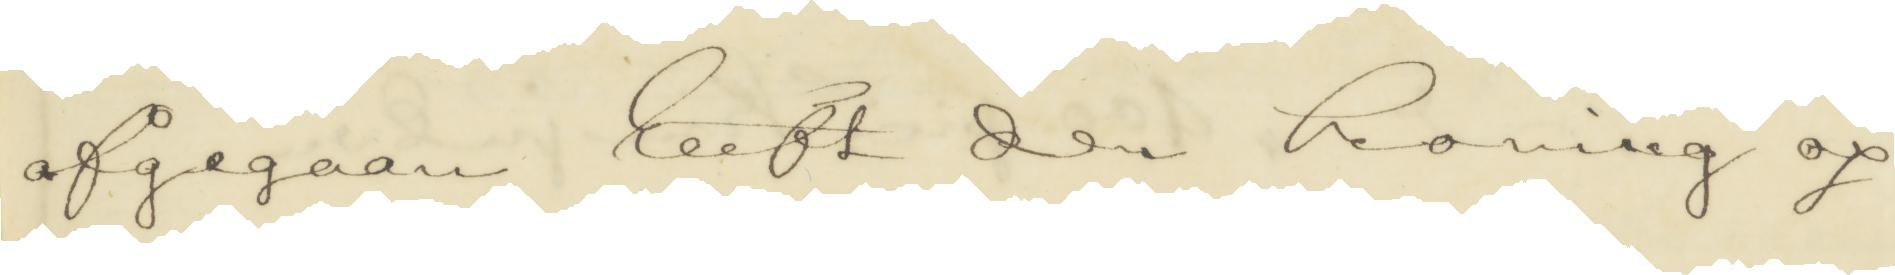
afgegaan, heeft den koning op
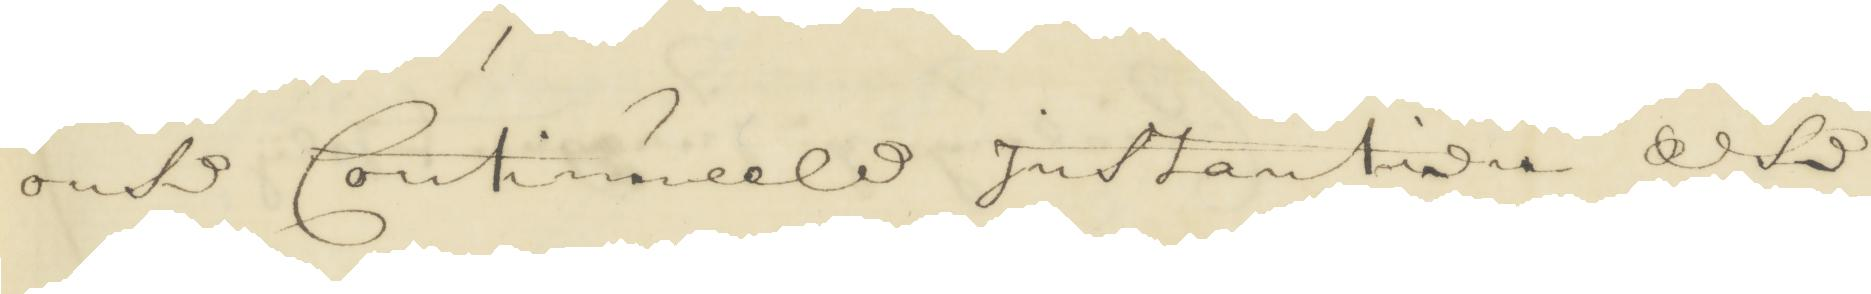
onse Continueele Jnstantien dese
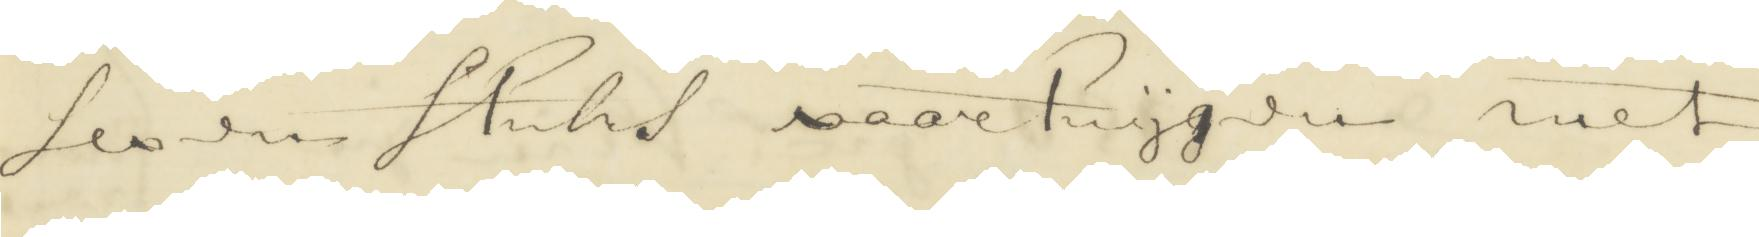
seven stuks vaartuijgen met
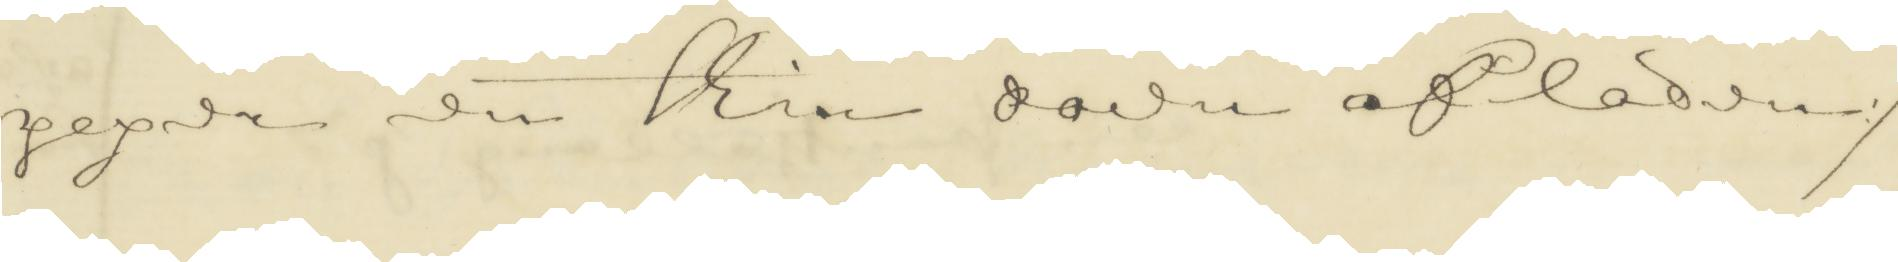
peper en thin doen afladen:/
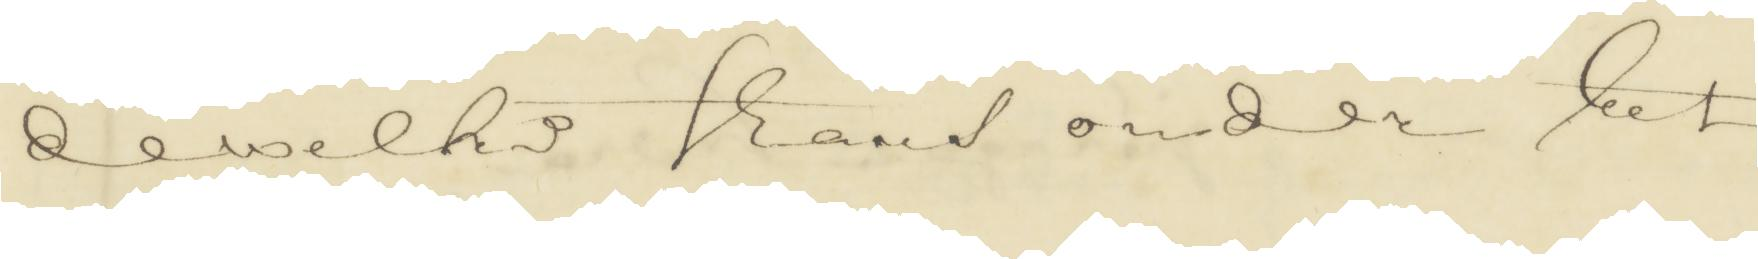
dewelke thans onder het
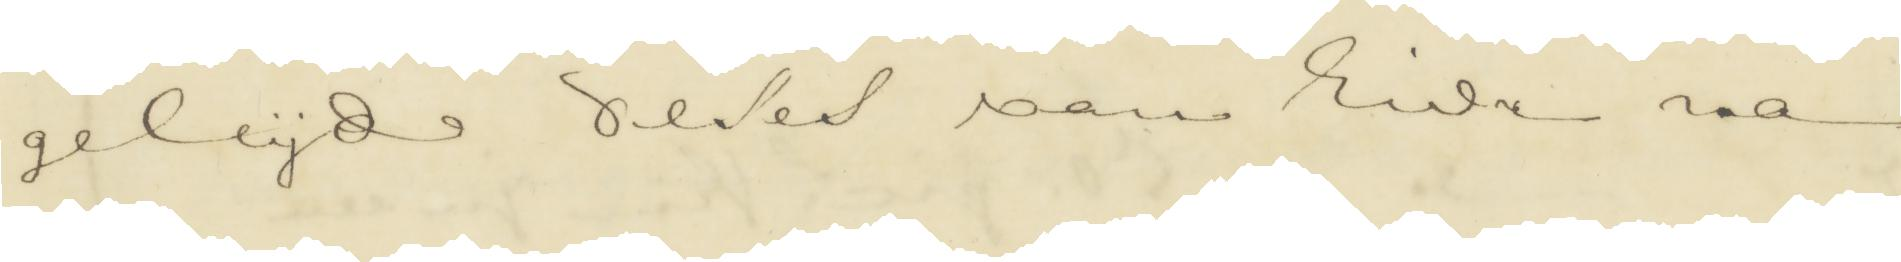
geleijde deses van hier na
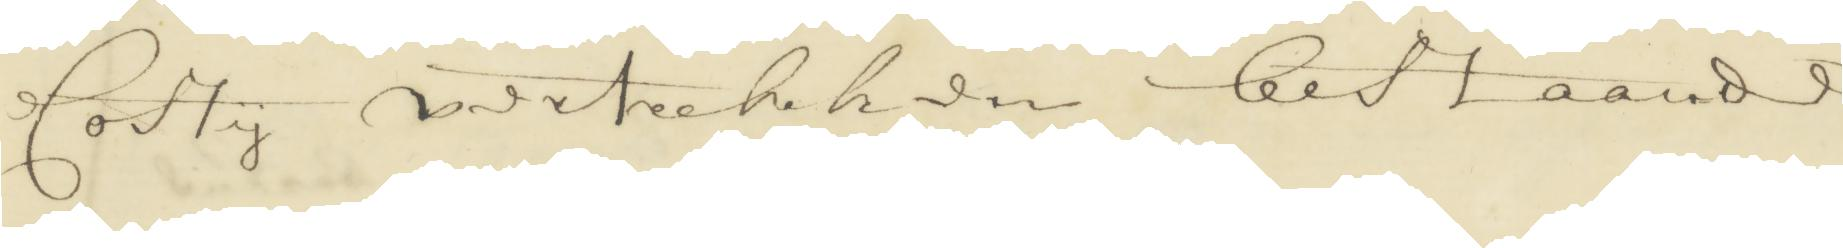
Costij vertrekken bestaande
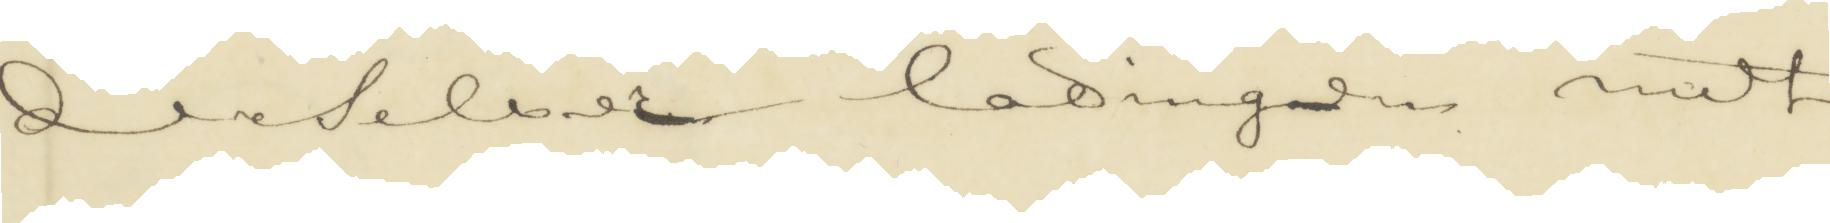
derselver ladingen met
